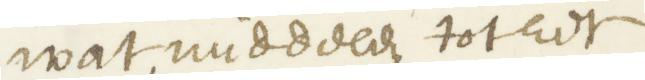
wat middelen tothet
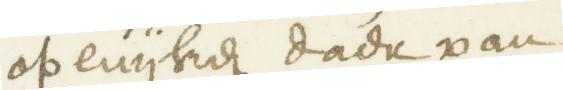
op luijken daer van
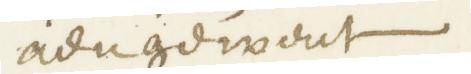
aengewent
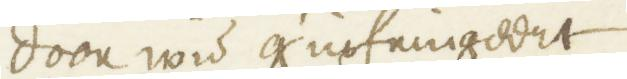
door wie g'infringeert
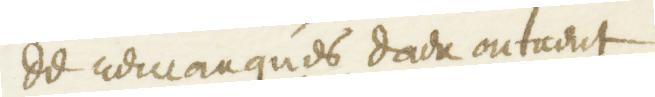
de remarques daer ontrent
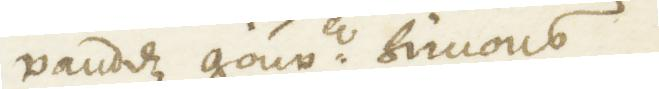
vanden gouv:' simons
